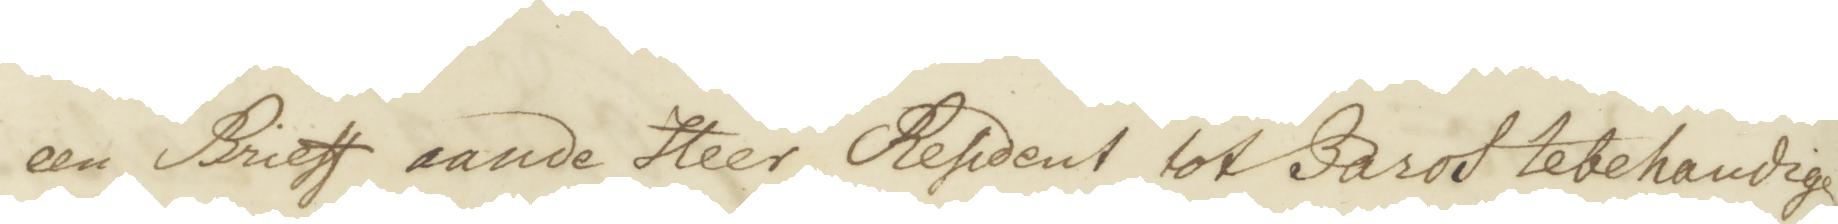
een Brieff aande Heer Resident tot Baros tebehandige
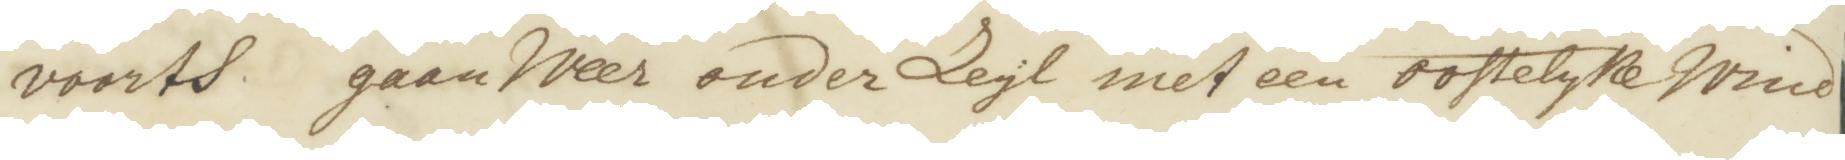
voorts. gaan weer onder zeijl met een oostelyke wind
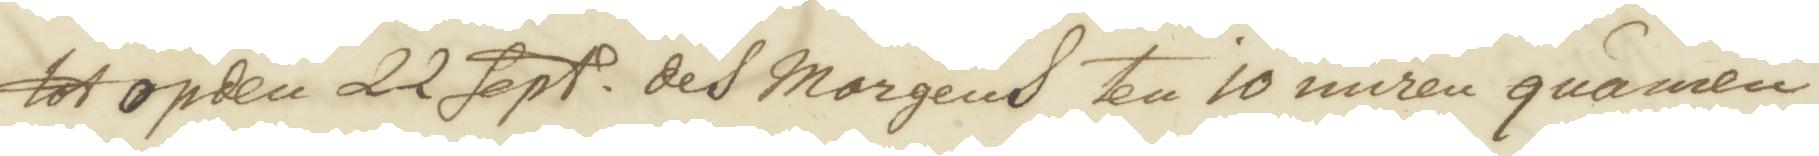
tot op den 22 sept. des morgens ten 10 uuren quamen
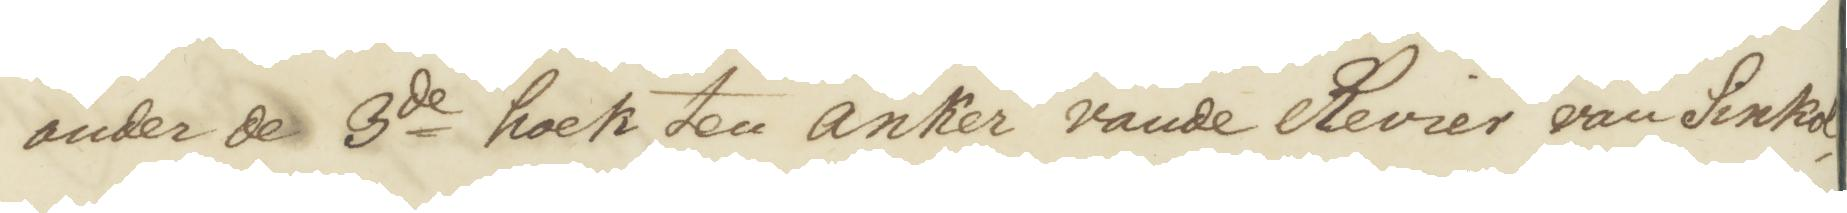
onder de 3=de hoek ten anker vande Revier van Sinkol,
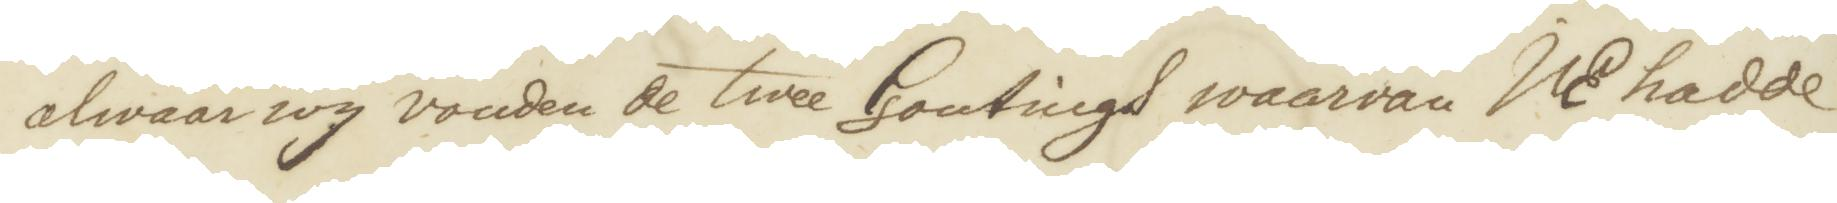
alwaar wij vonden de twee Gontings waarvan UE hadde
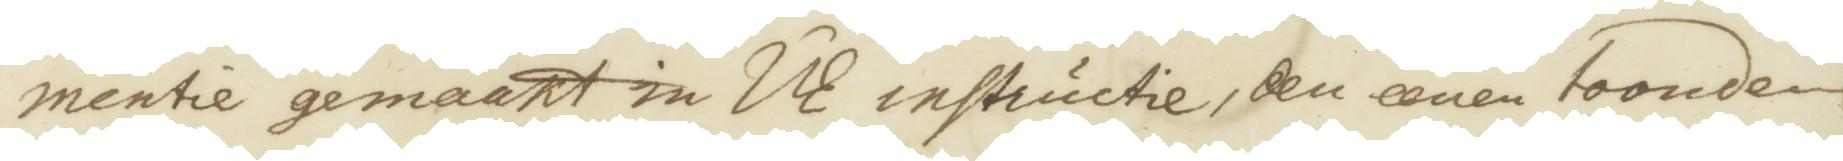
mentie gemaakt in UE instructie, den eenen toonden
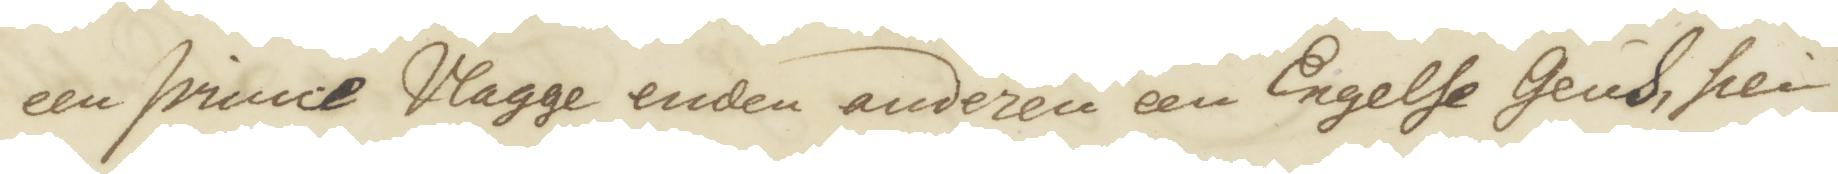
een prince Vlagge enden anderen een Engelse Geus, sien
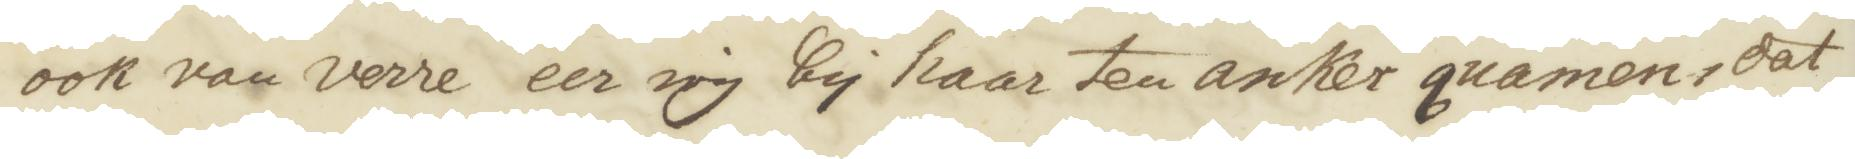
ook van verre eer wij bij haar ten anker quamen, dat
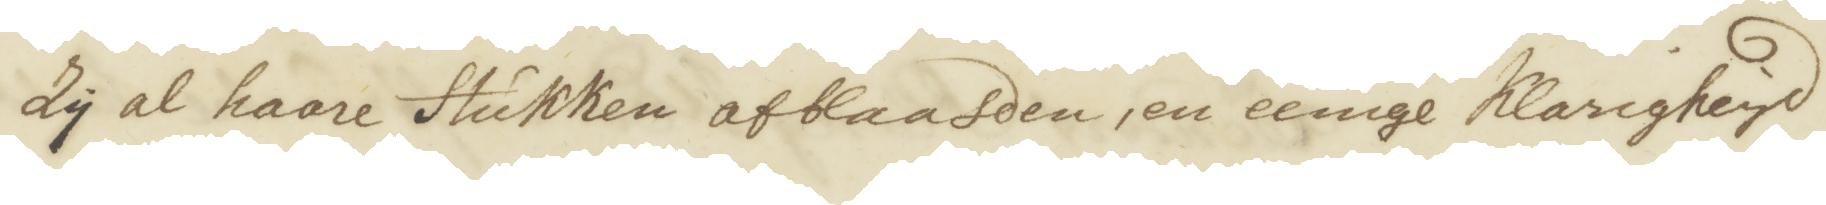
zij al haare stukken afblaasden, en eenige klarigheijd
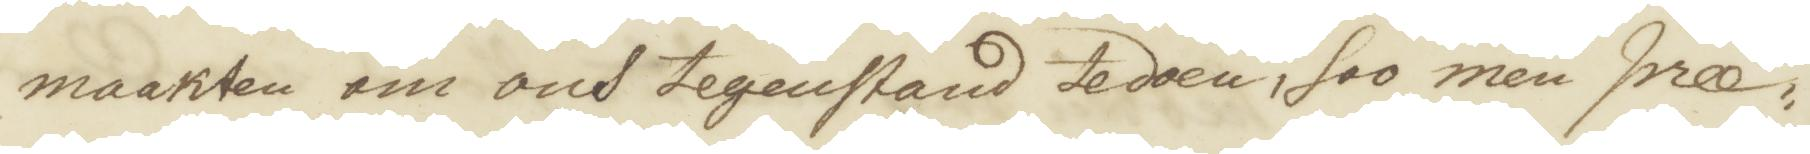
maakten om ons tegenstand te doen, soo men pree„
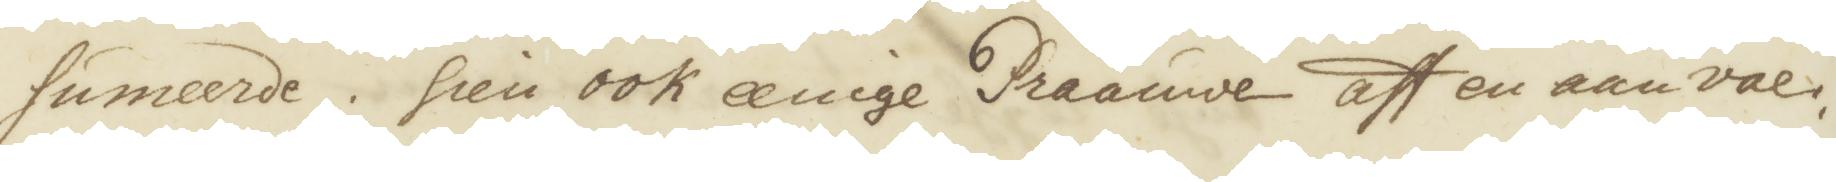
sumeerde. sien ook eenige Praauwe aff en aan vae„
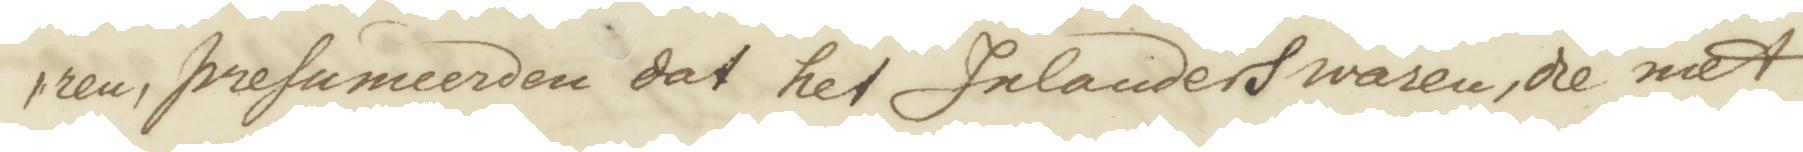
ren, presumeerden dat het Inlanders waren, die met
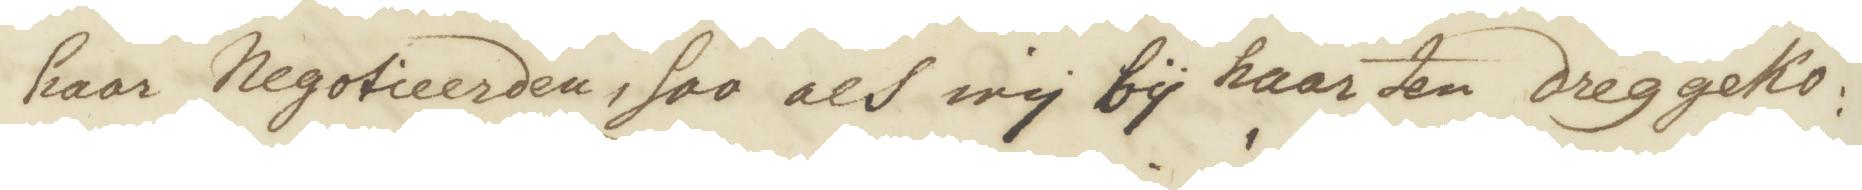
haar negotieerden, soo als wij bij haar ten dreg geko:
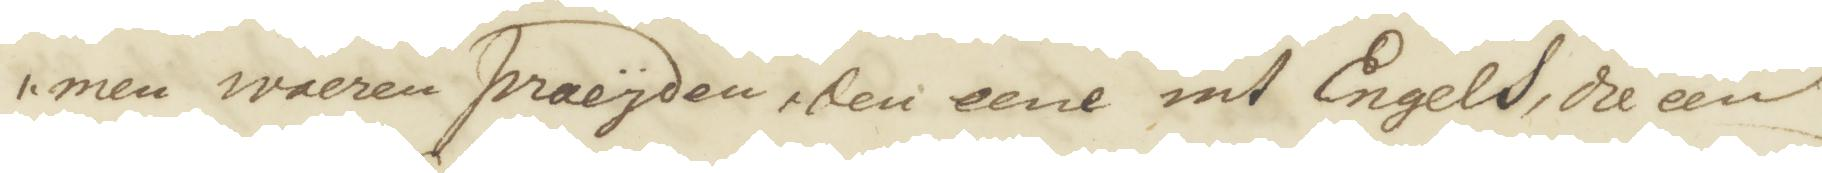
„men waeren praeijden, den eene in't Engels, die een
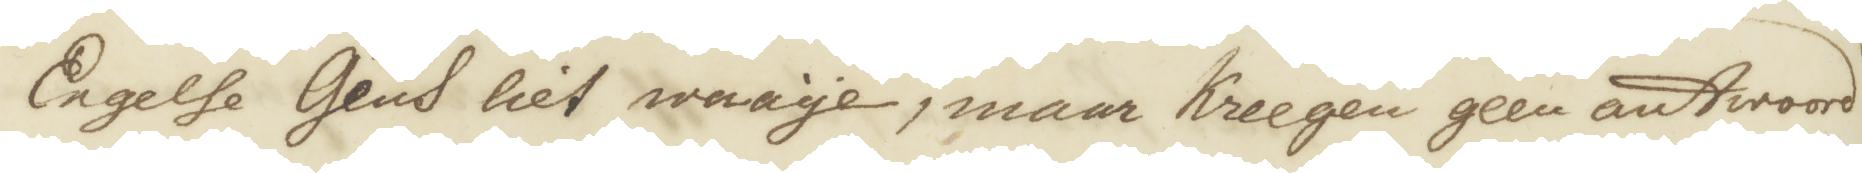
Engelse Geus liet waaije, maar kreegen geen antwoord
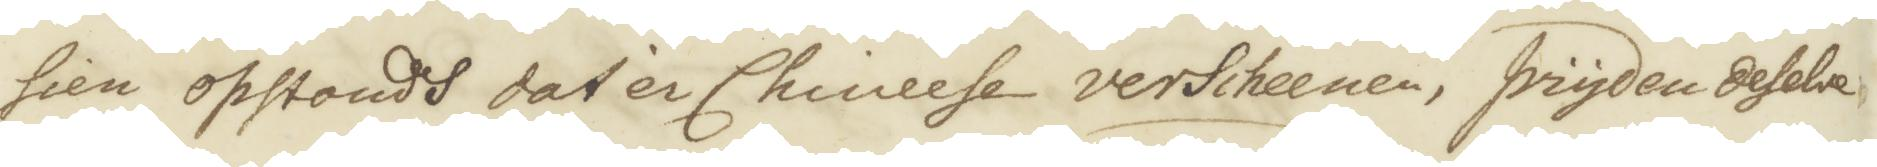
sien opstonds dat er Chineese verscheenen, prijden deselve
